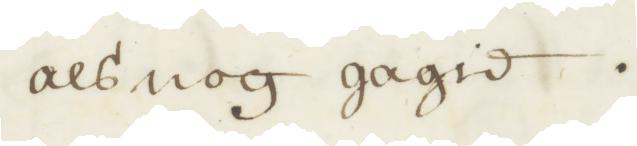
als nog gagie.
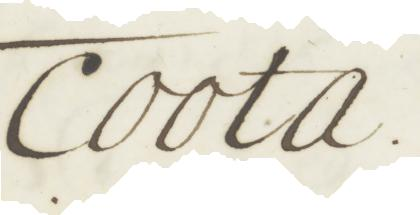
Coota.
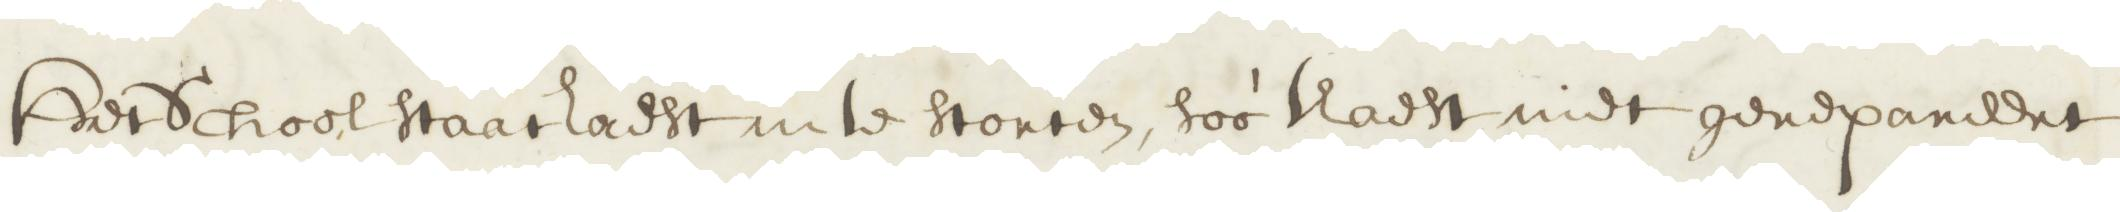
Het school staat haest in te storten, soo 'thaest niet gerepareert
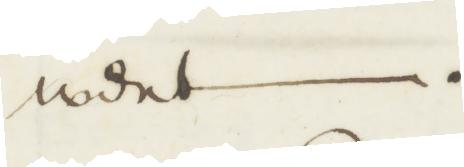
wert.
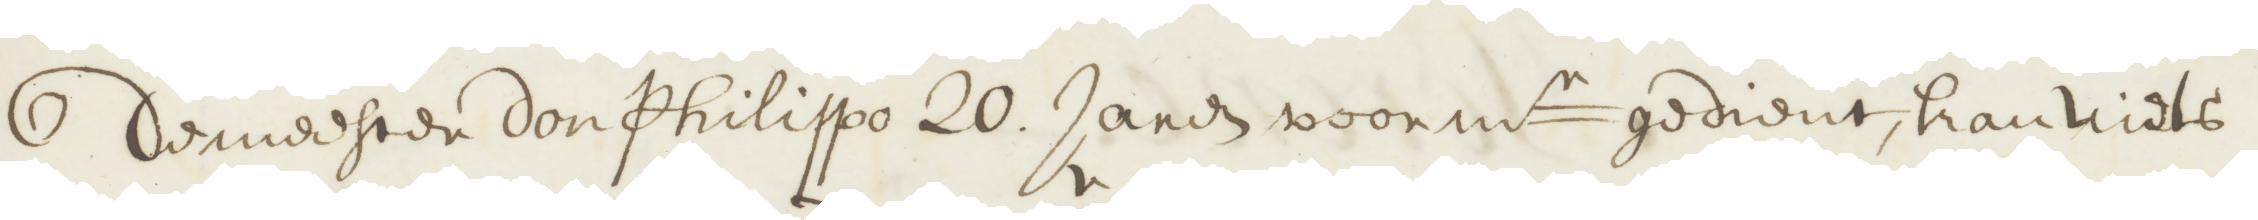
de meester don Philippo 20. Jaren voor m=r gedient, kan niets
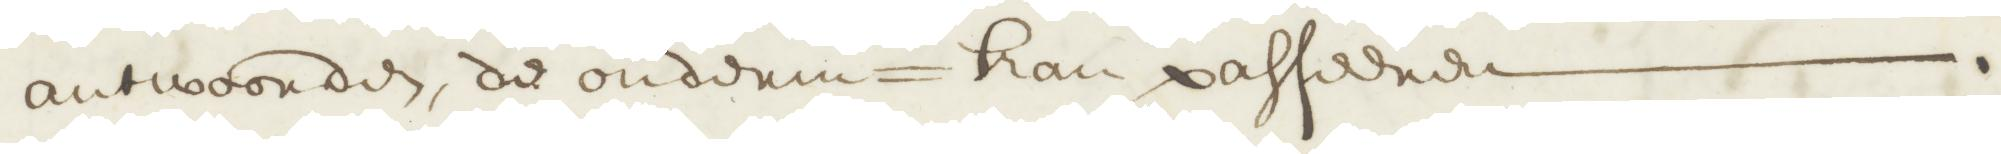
antwoorden, de onderm=r kan passeeren.
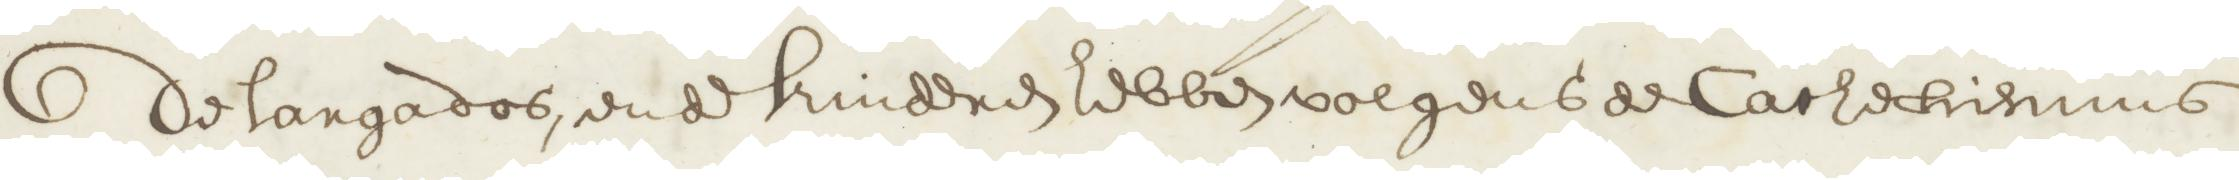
de largados, en de kinderen hebben volgens de Cathechismus
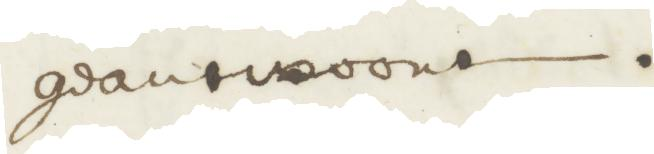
geantwoort.
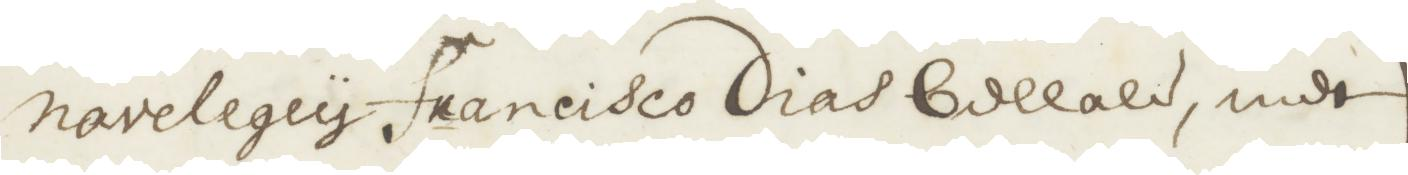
navelegeij Francisco dias bellale, met
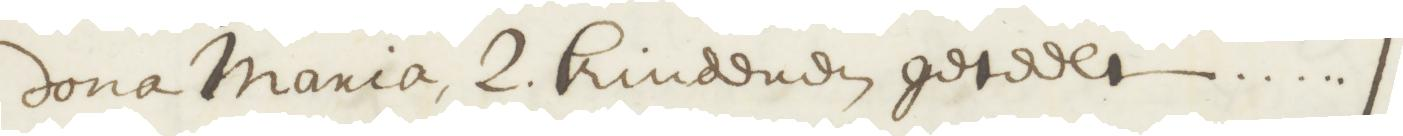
dona Maria, 2. kinderen geteelt. . . . .
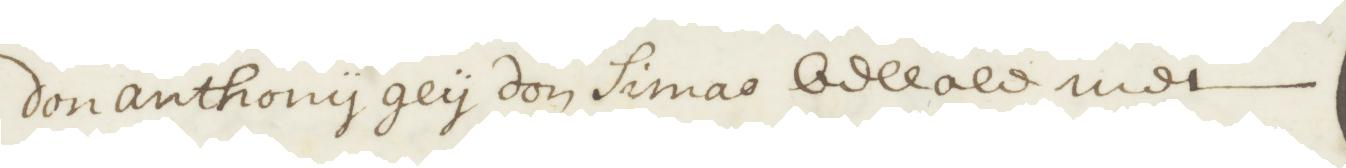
don anthonij geij don simas bellale met
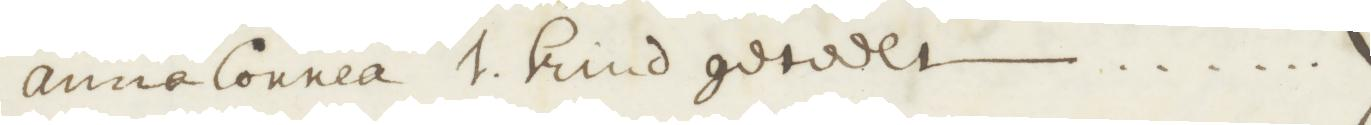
anna Correa 1. kind geteelt . . . . . .
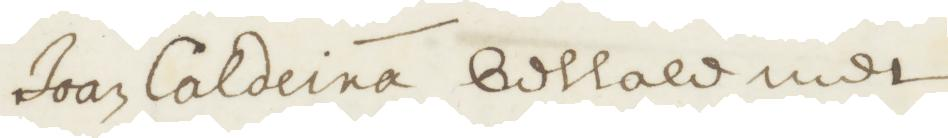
Ioan Caldeira bellale met
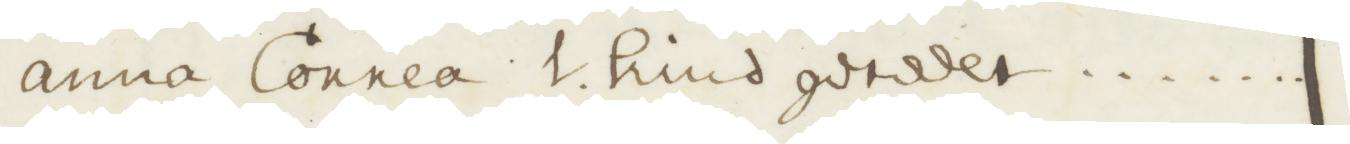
anna Correa 1. kind geteelt . . . . . . .
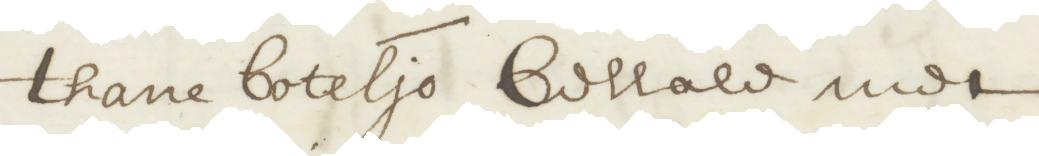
thane boteljo bellale met
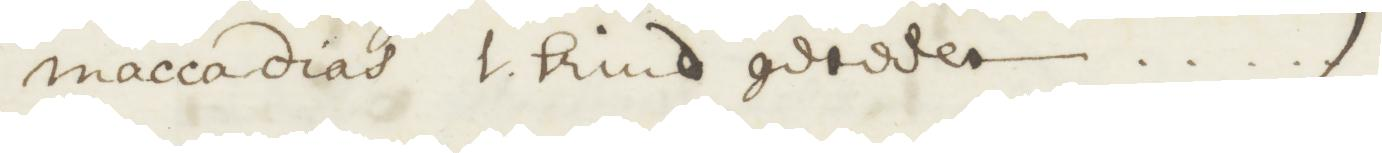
macca dias 1. kind geteelt . . . . .
